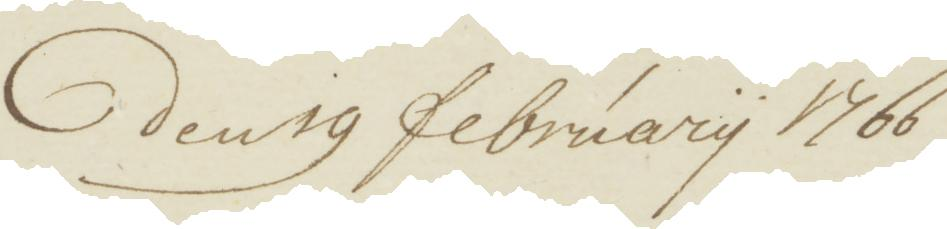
den 19 februarij 1766
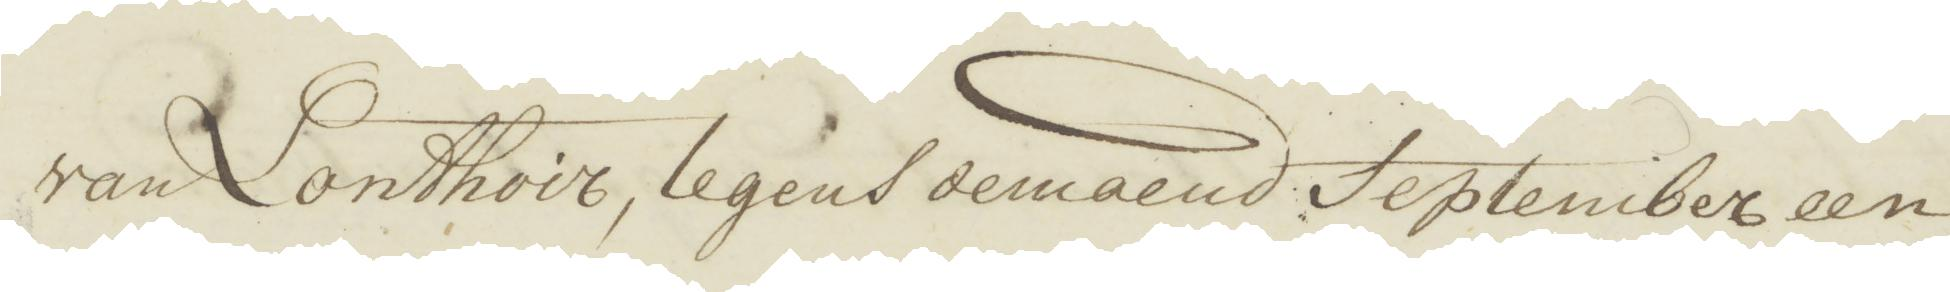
van Lonthoir, tegens demaend september een
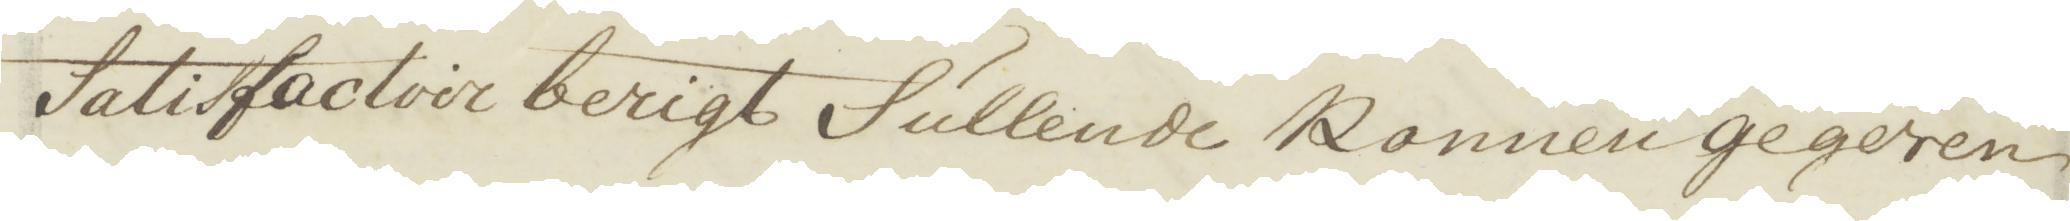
satisfactoir berigt sullende konnen gegeven
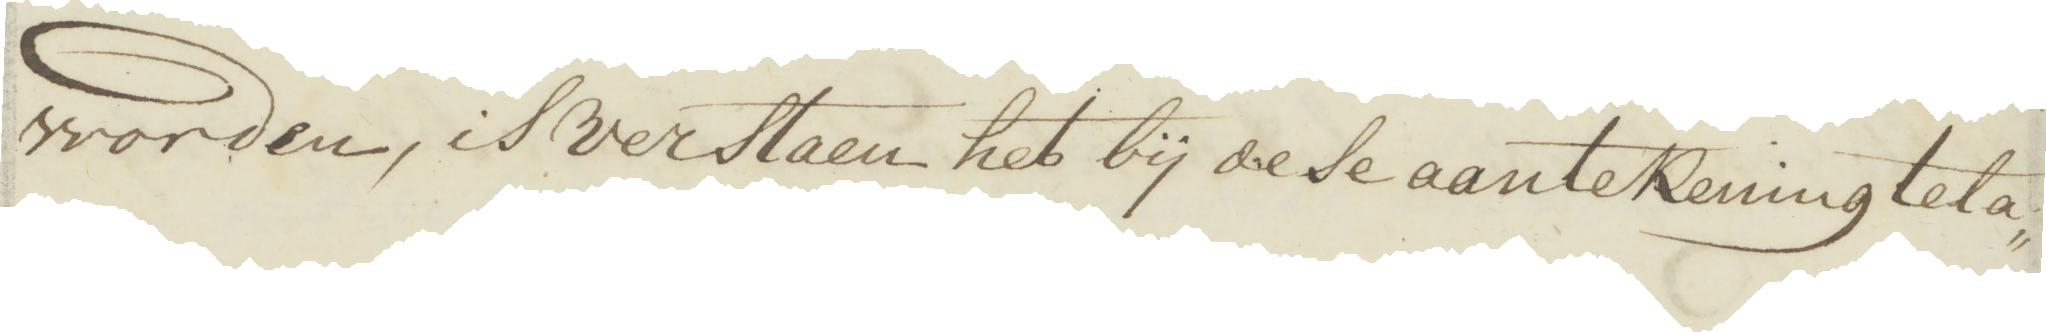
worden, is verstaen het bij dese aantekening tela„
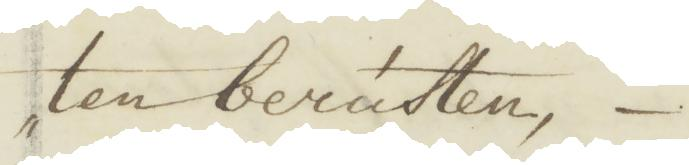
„ten berusten, —
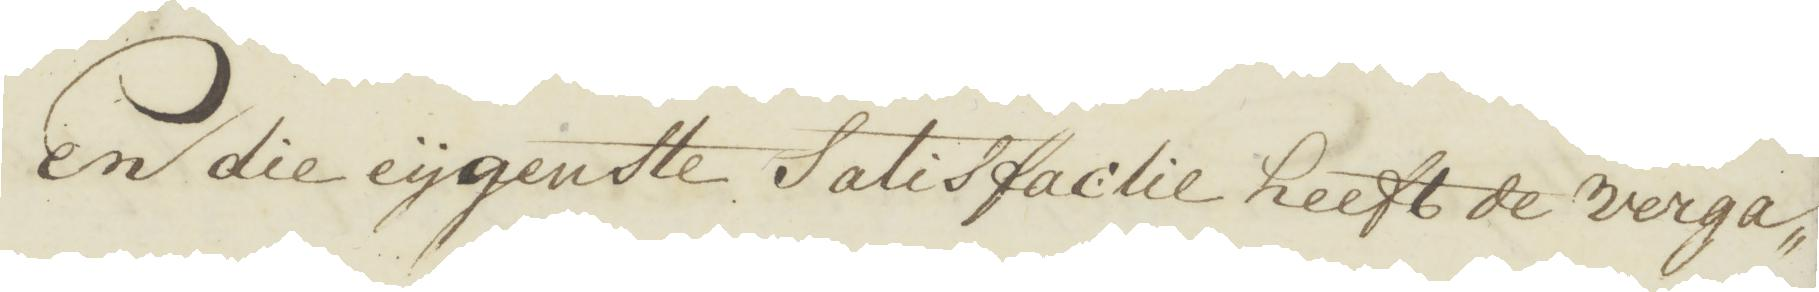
En die eijgenste satisfactie heeft de verga„
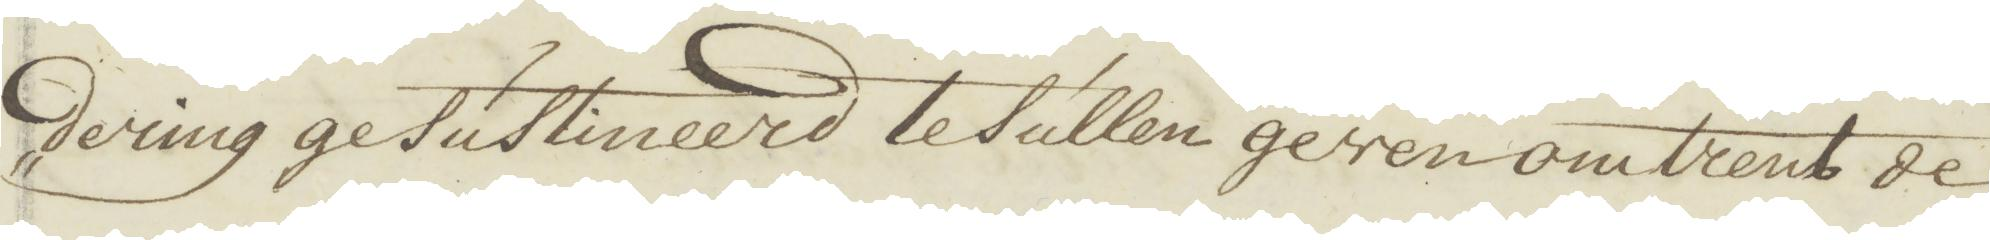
„dering gesustineerd te sullen geven omtrent de
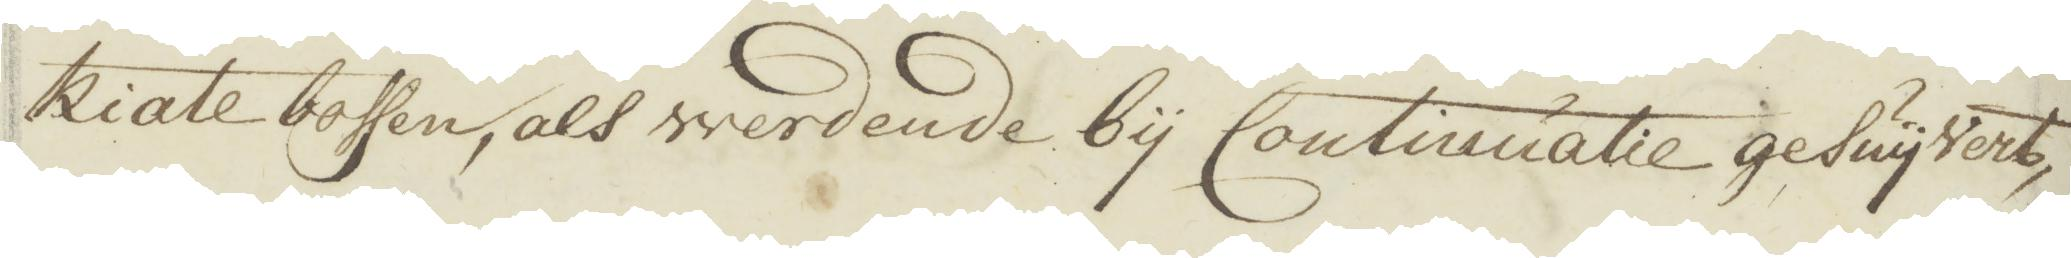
kiate bossen, als werdende bij Continuatie gesuijvert,
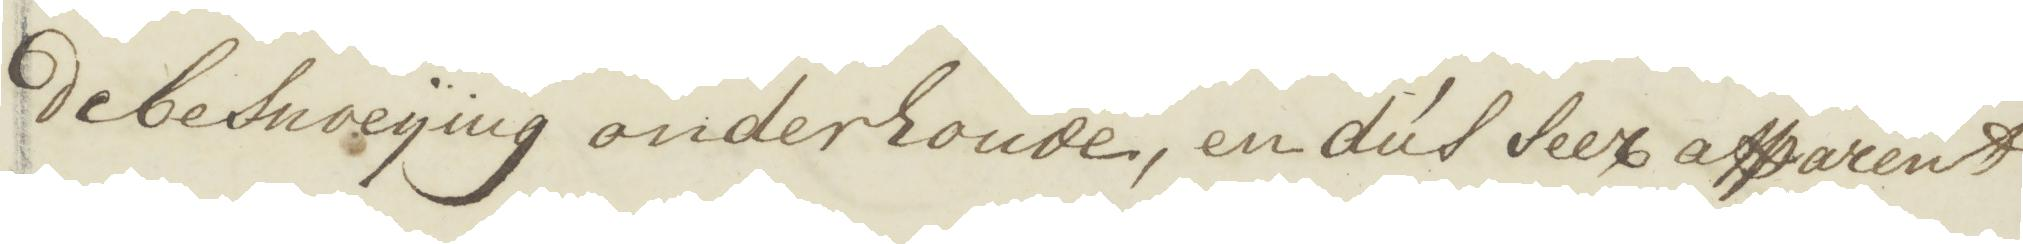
de besnoeijing onderhoude, en dus seer apparent
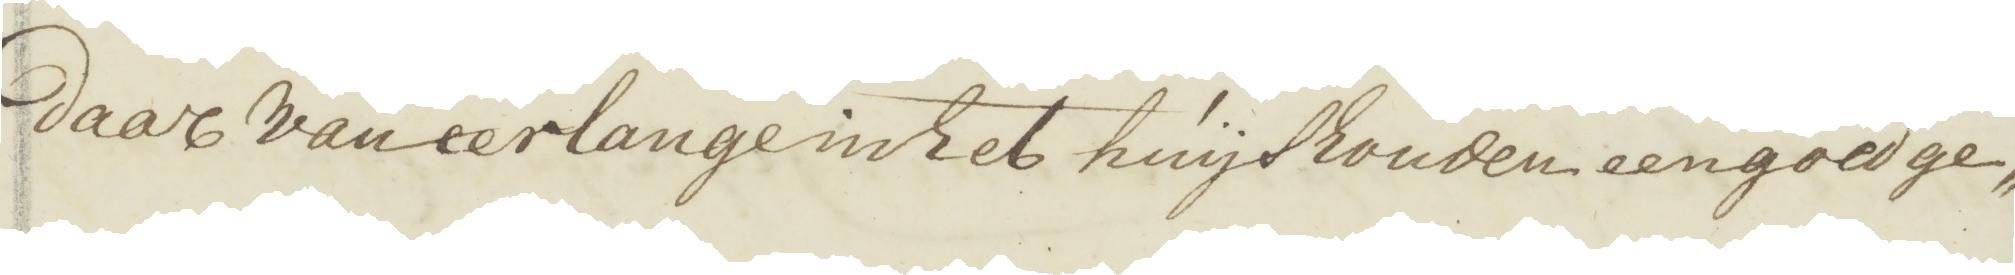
daar van eerlange in het huijshouden een goed ge
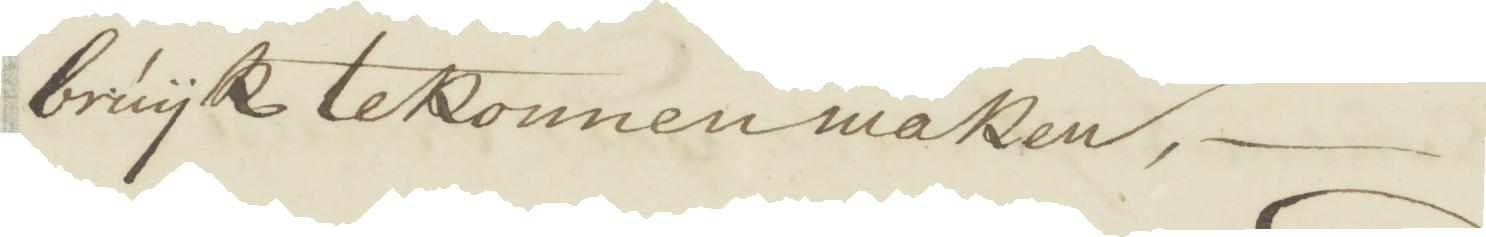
bruijk te konnen maken, —
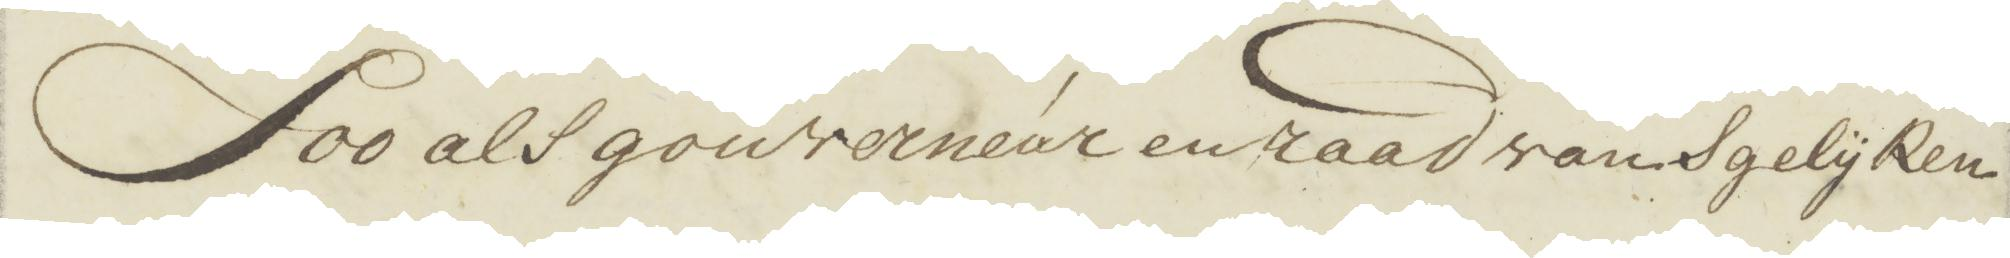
Soo als gouverneur en raad van s gelijken
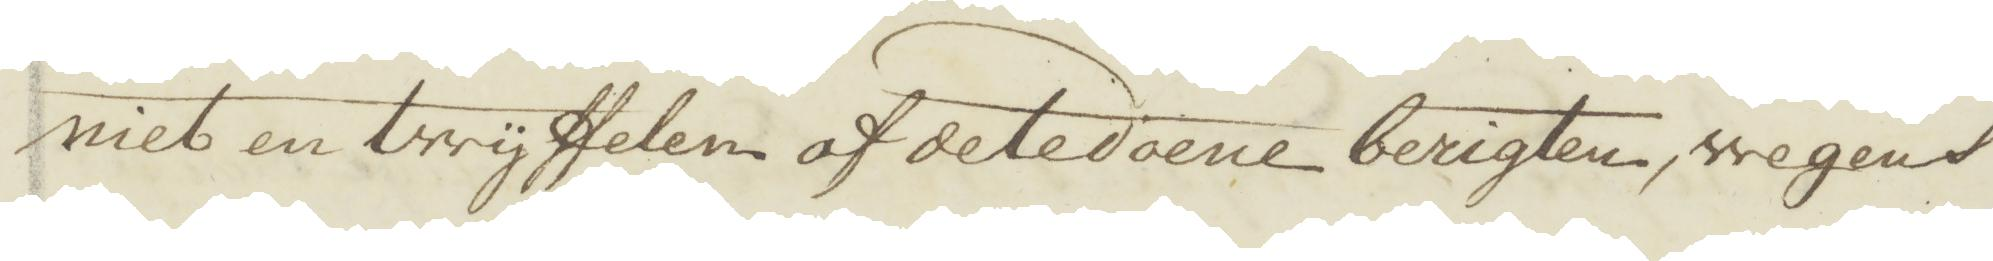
niet en twijffelen of detedoene berigten, wegens
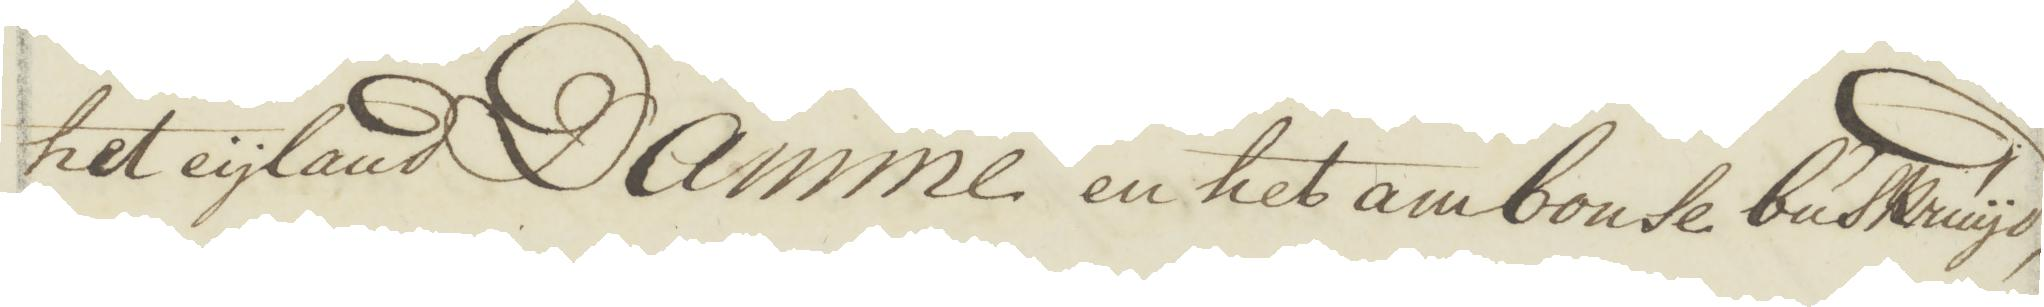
het eijland Damme en het ambonse buskruijd
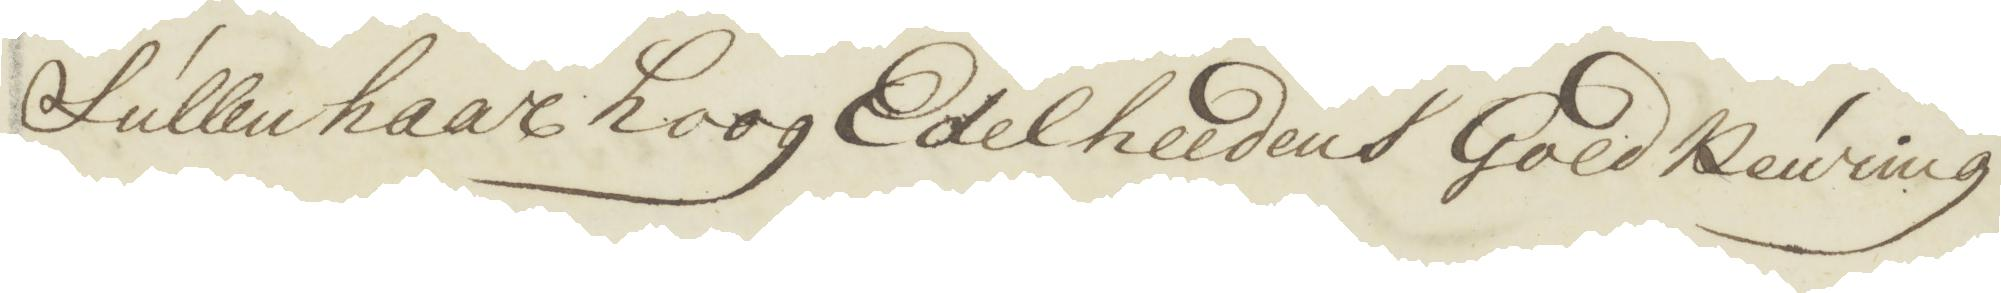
sullen haar hoog Edelheedens Goed keuring
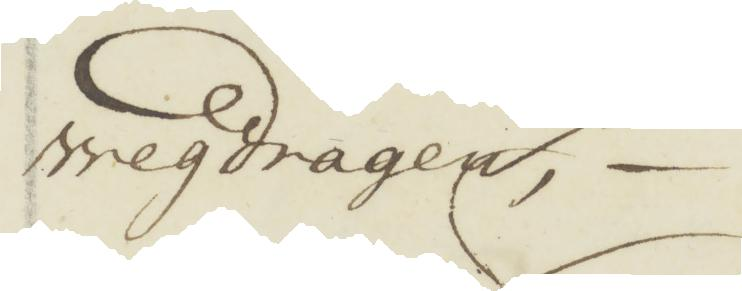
wegdragen, —
